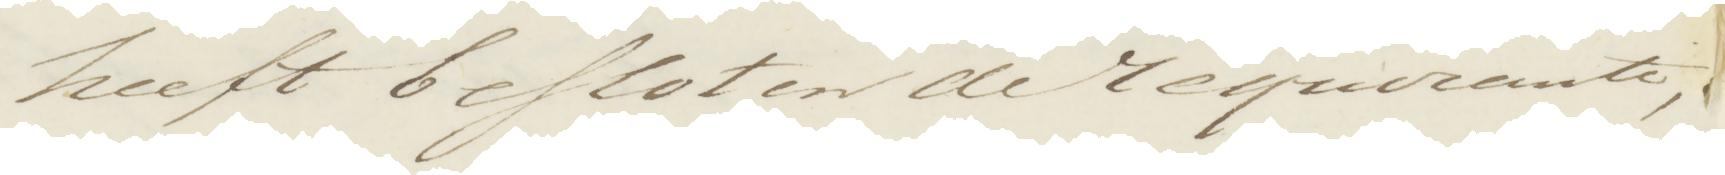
heeft besloten de requirante,
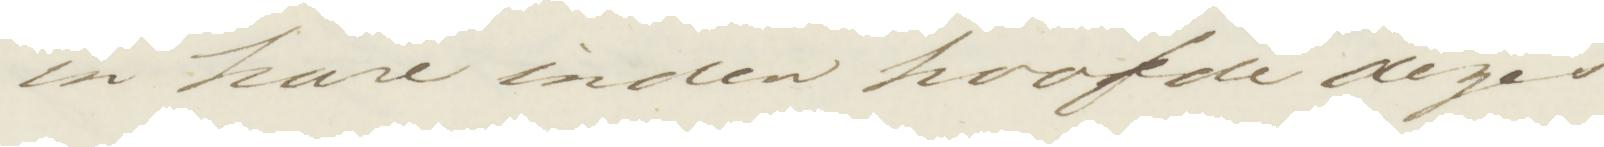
in hare inden hoofde dezes
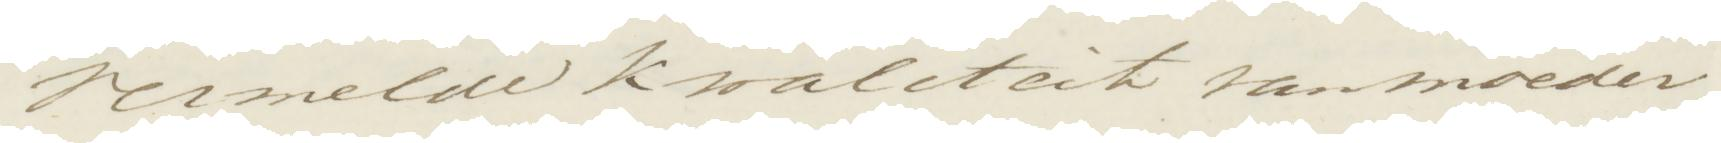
vermelde kwaliteit van moeder
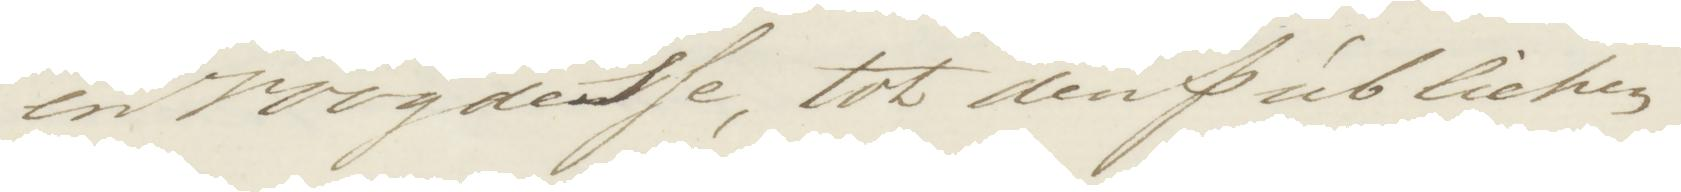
en voogdesse, tot den publieken
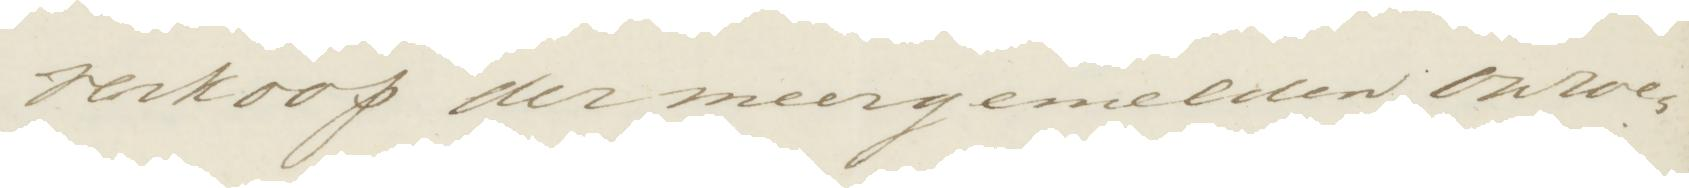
verkoop der meergemelden onroe„
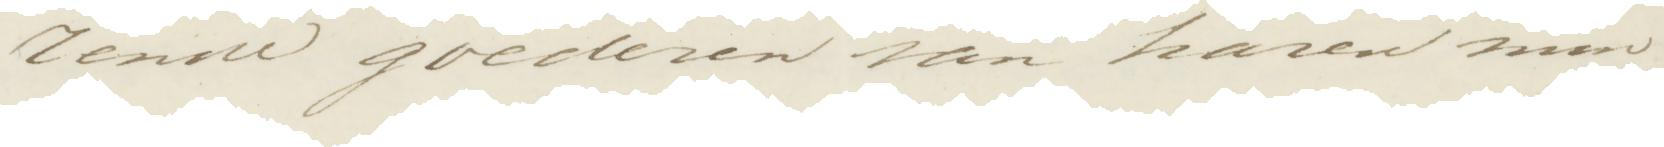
rende goederen van haren min
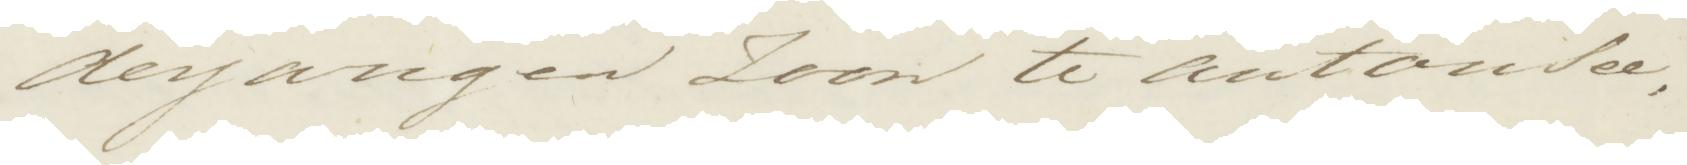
derjarigen zoon te autorisee„
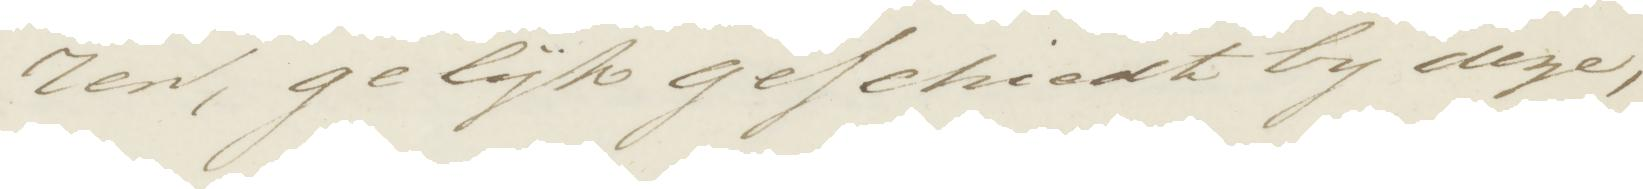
ren, gelijk geschiedt by deze,
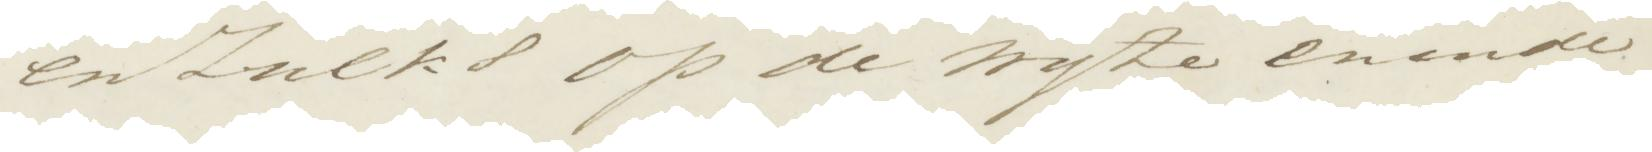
en zulks op de wijze en inde
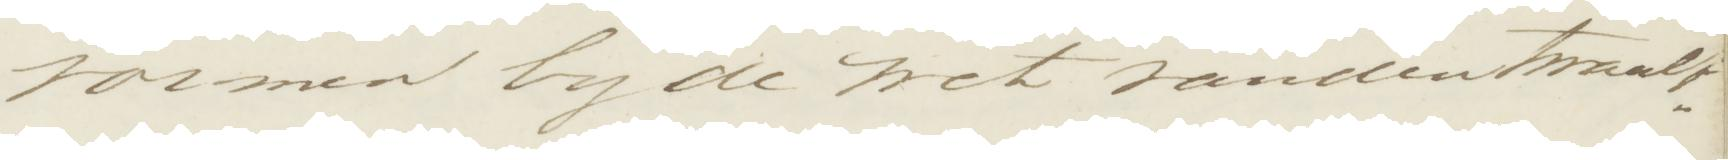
vormen by de wet vandentwaalf„
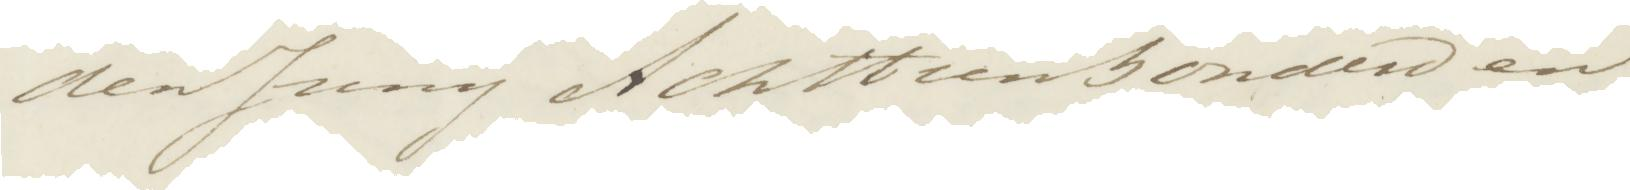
denJuny Achttienhonderd en
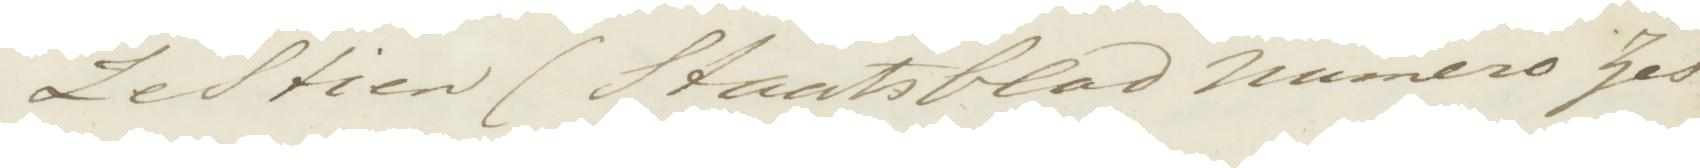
Zestien (staatsblad numero zes
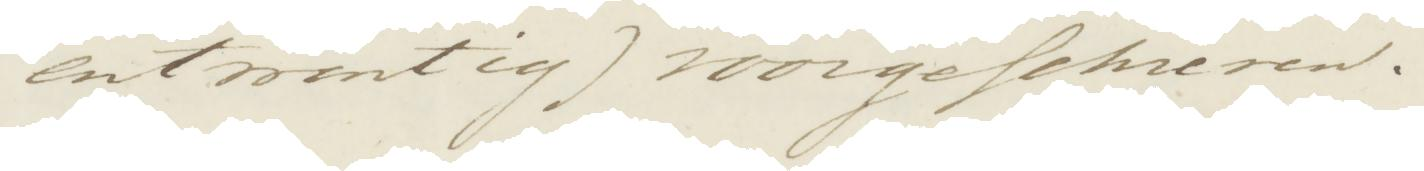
entwintig) voorgeschreven.
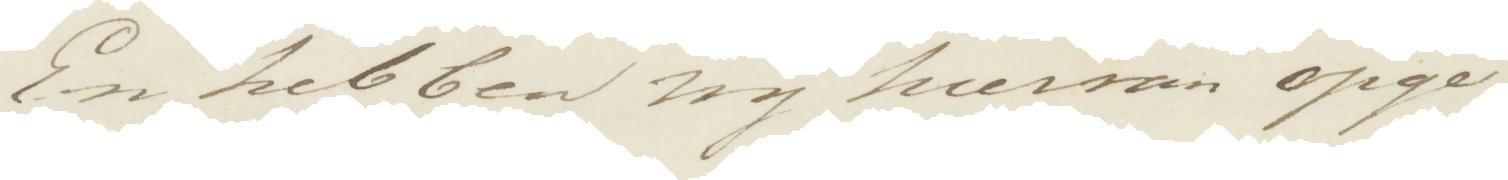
En hebben wij hiervan opge
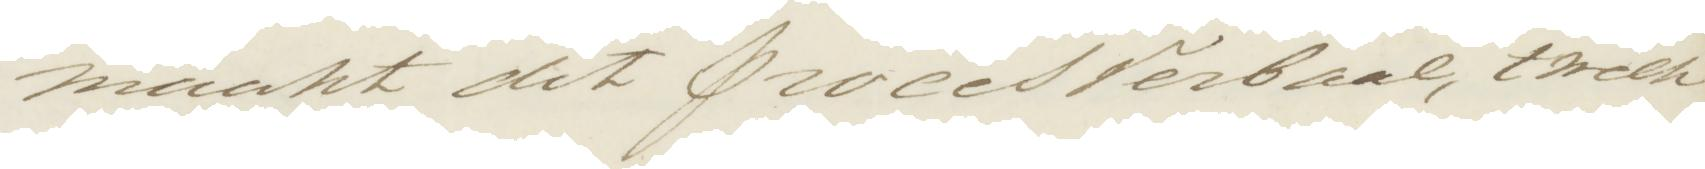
maakt dit Proces Verbaal, 'twelk
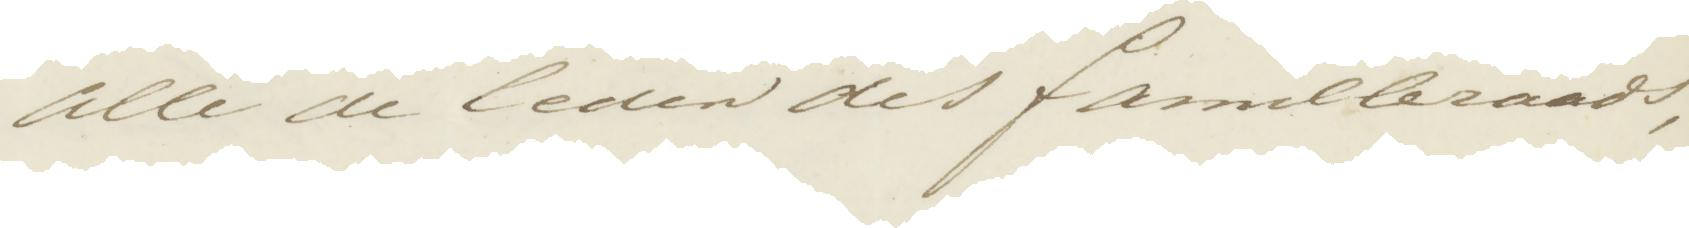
alle de leden des familleraads,
